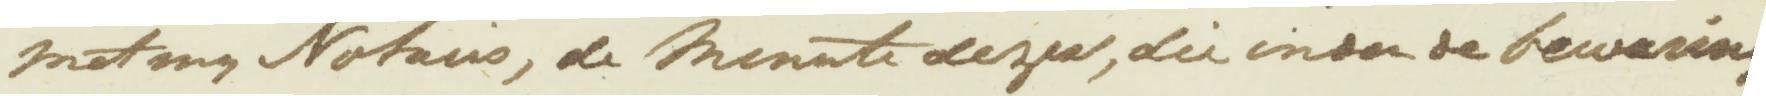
met my Notaris, de Minute dezer, die inden de bewaring
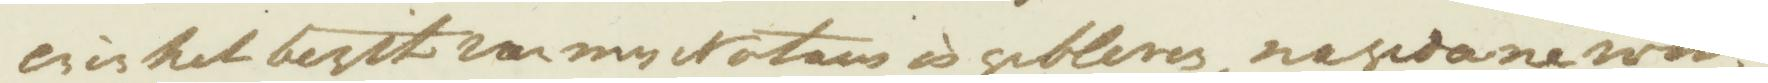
en in het bezit van my Notaris is gebleven, nagedane voor
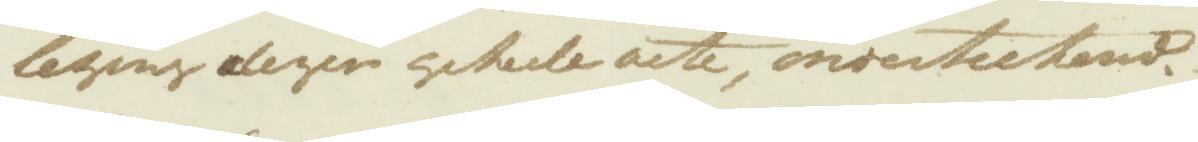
lezing dezer geheele acte, onderteekend.
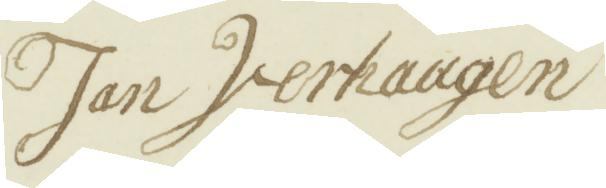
Jan Verhaagen
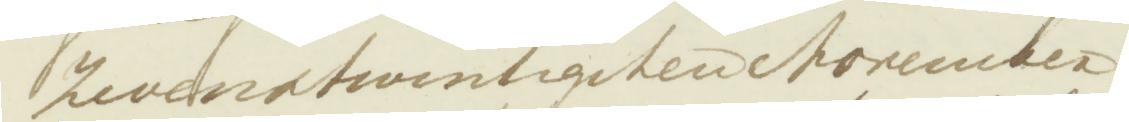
Zevenstwintigsten November
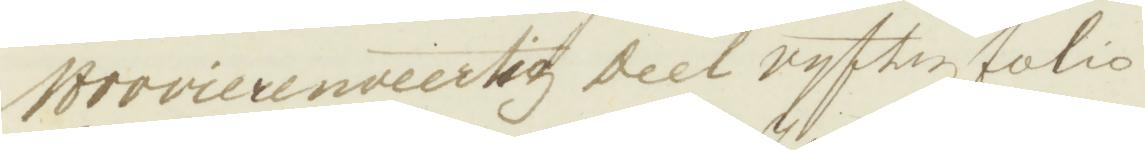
1800vierenveertig deel vyftig folio
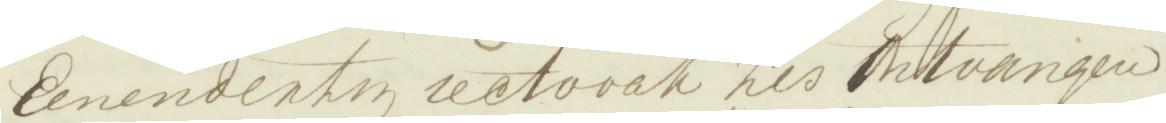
Eenendertig recto vak zes Ontvangen
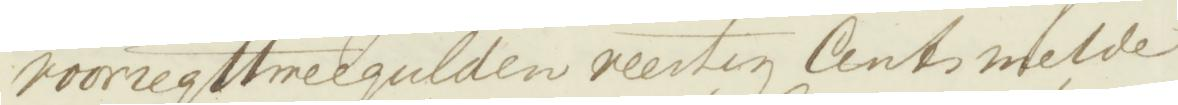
voorregt twee gulden veertig Cents met de
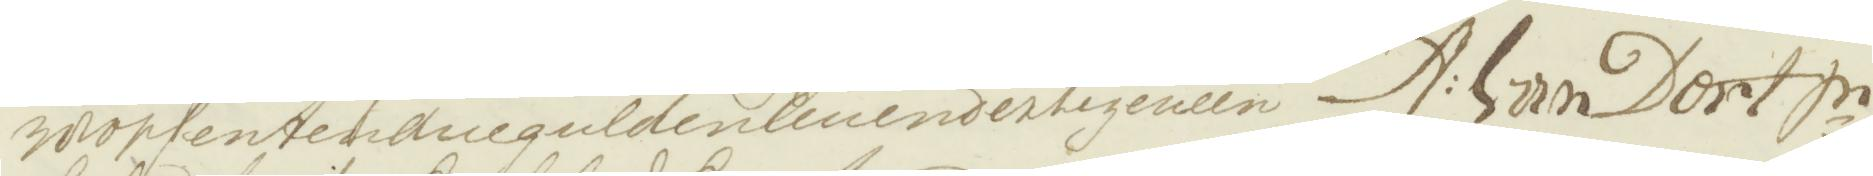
30 opcenten drie gulden Eenendertig en een A: Van Dort Jr
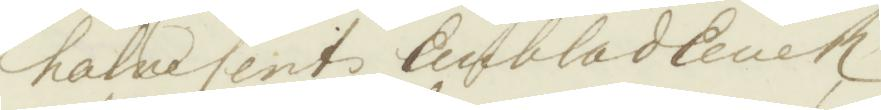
halve Cents Een blad Een R
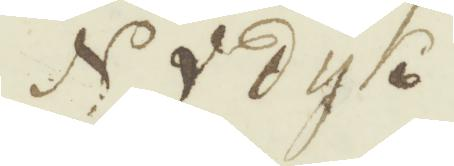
N: V dyk
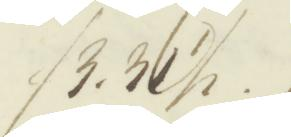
ƒ3.31½.
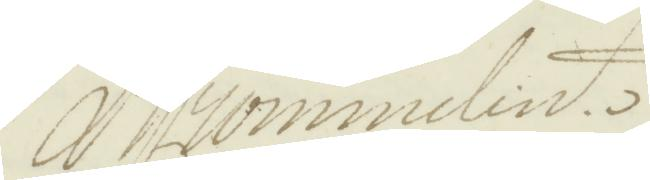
df Crommelin.
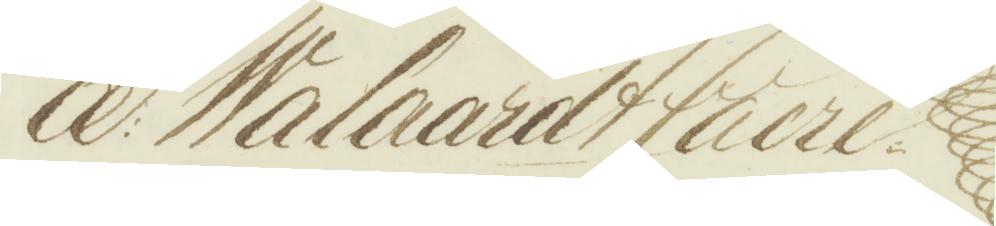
a: Walaardt Sacre
